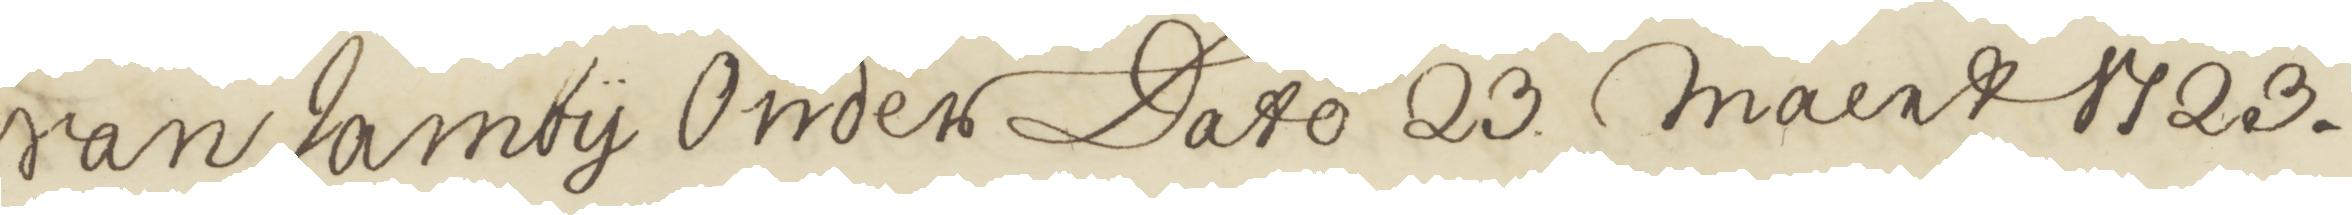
van Jambij onder Dato 23. maert 1723.
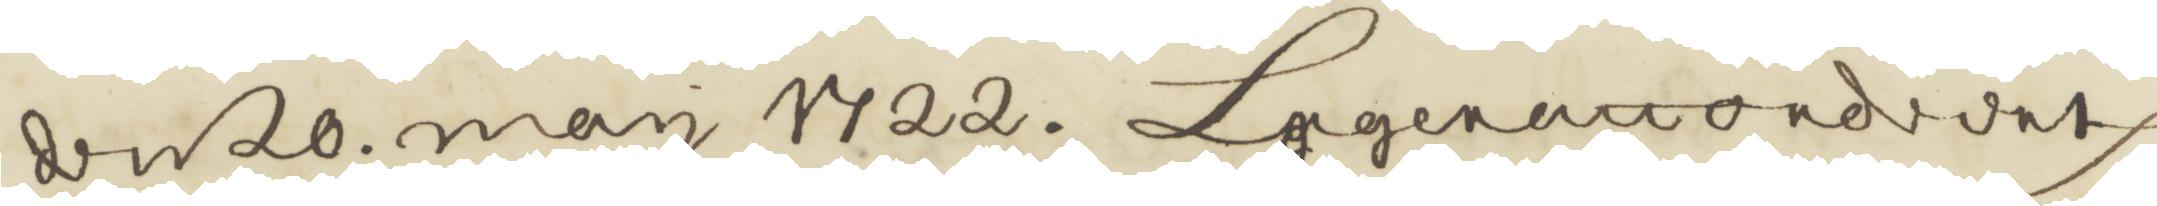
den 20. maij 1722. Lager accordeert
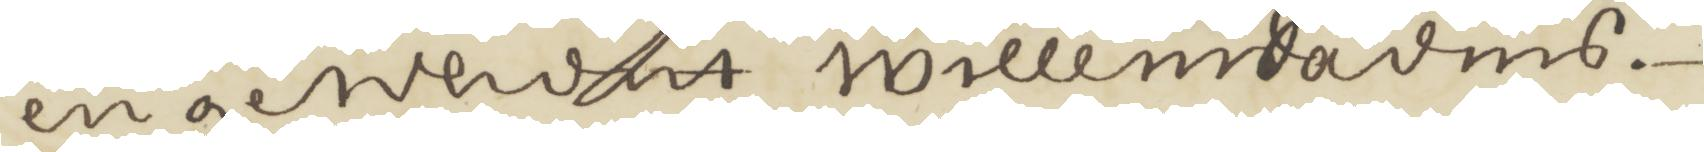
en getekent Willem daems. —
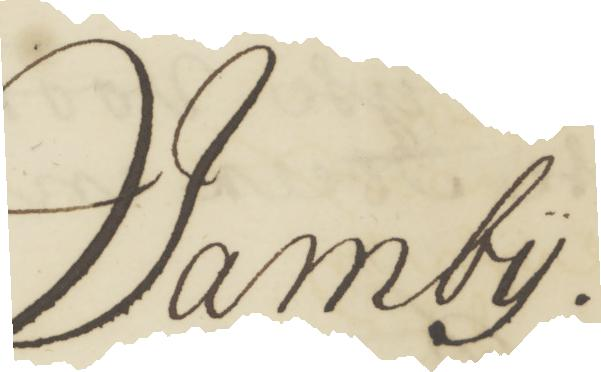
Jambij.
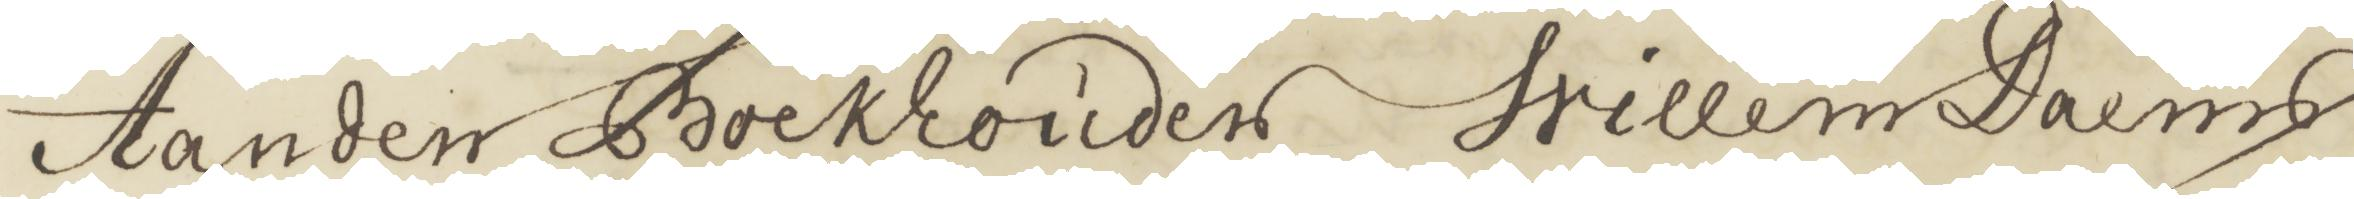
Aan den Boekhouder Willem Daems
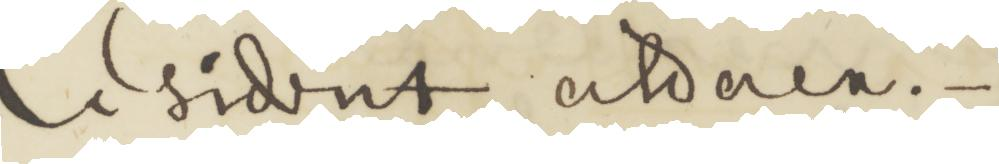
resident aldaer. –
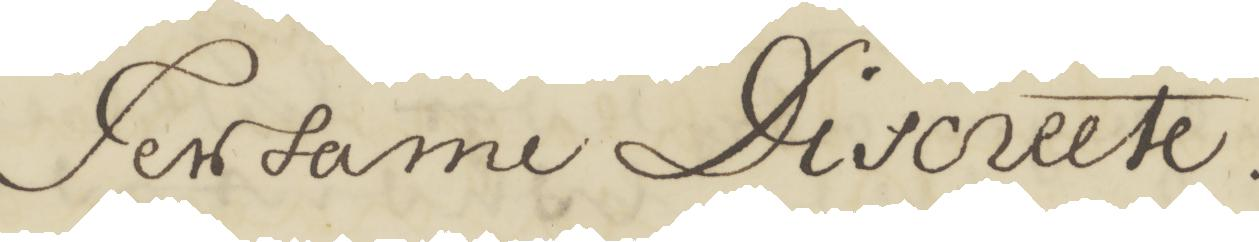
Eersame Discreete.
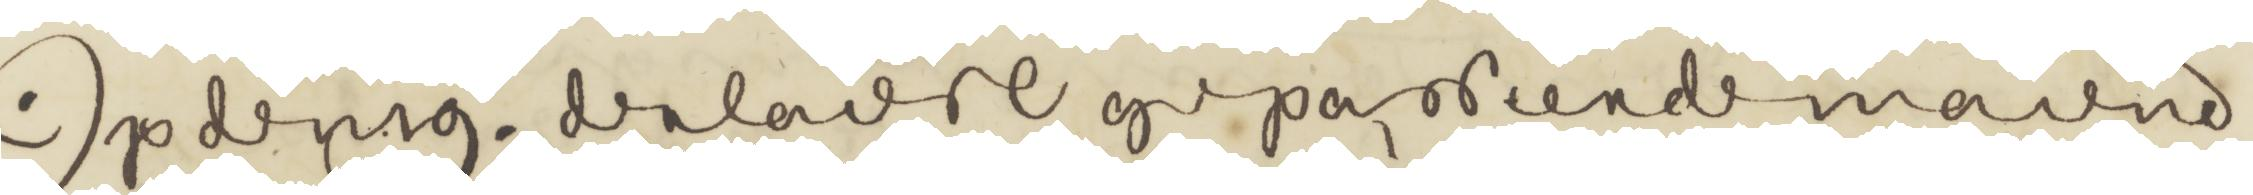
Op den 19. derlaest gepasseerde maend
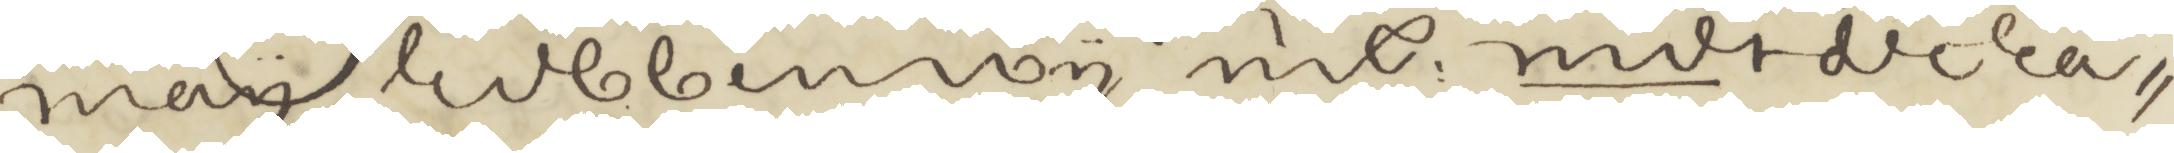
maij hebben wij uE: met de cha„
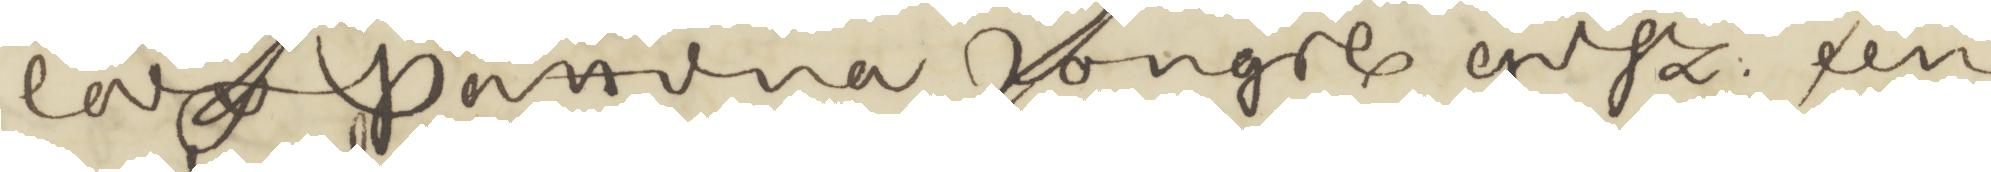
loep Parena jongst gesz: een
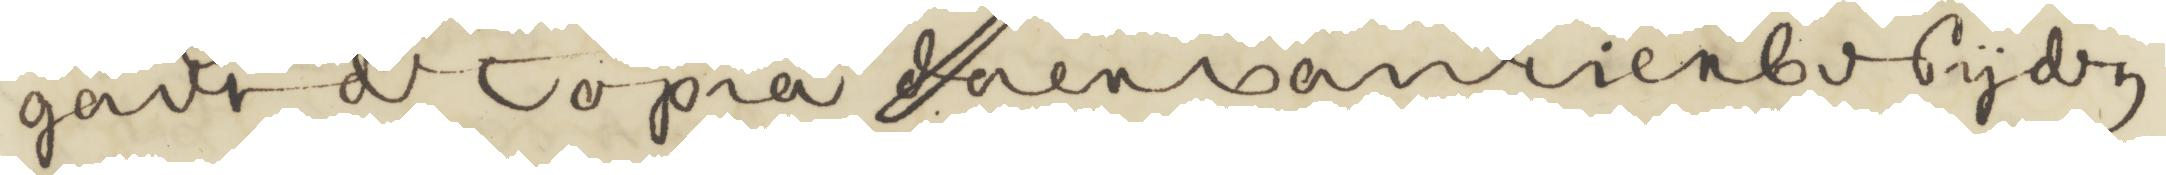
gaet de Copia daervan hier besijden
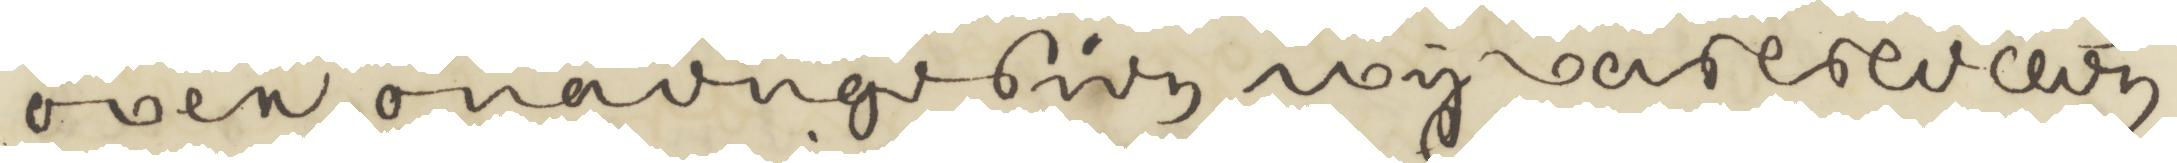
over onaengesien wij vaststellen
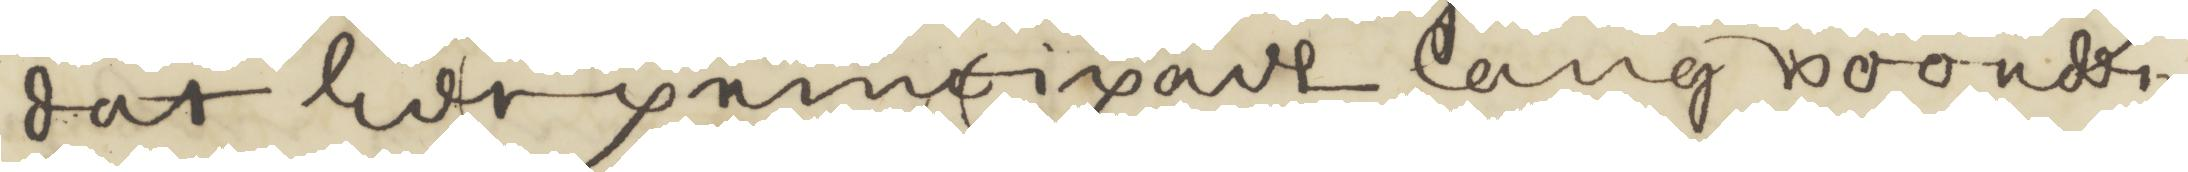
dat het principael lang voorden
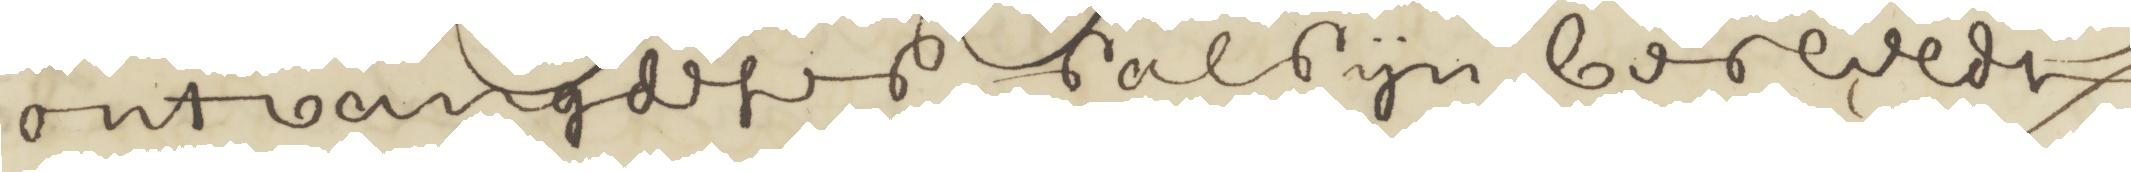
ontvangdeses salsijn besteldt
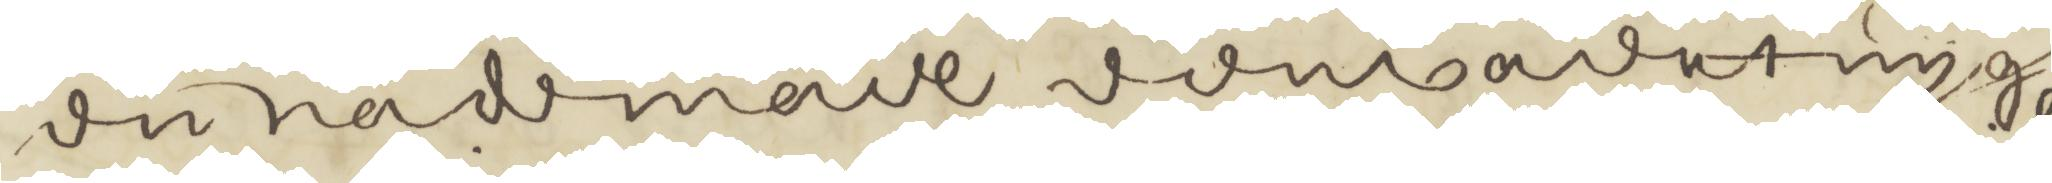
en nademael een vaertuijg
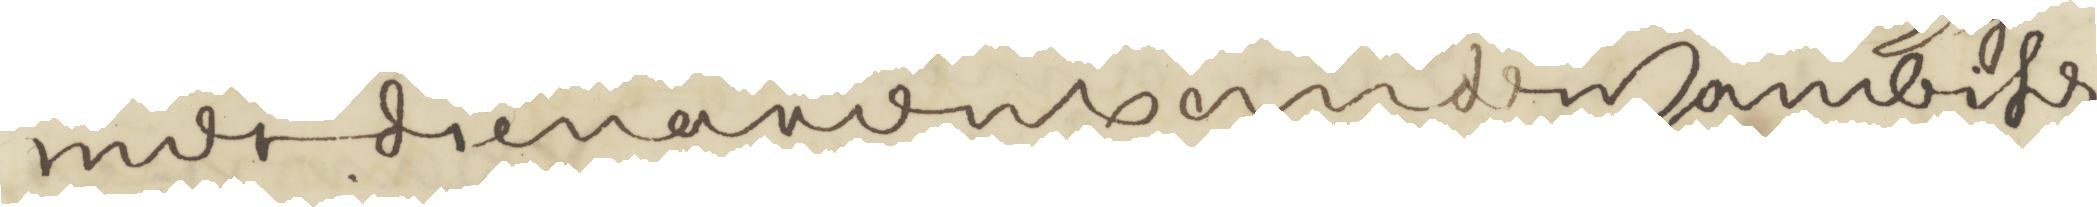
met dienaren van den Jambisen
